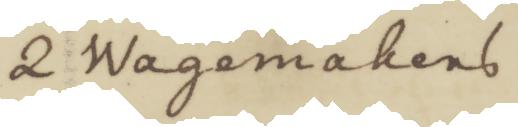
2 wagemakers
